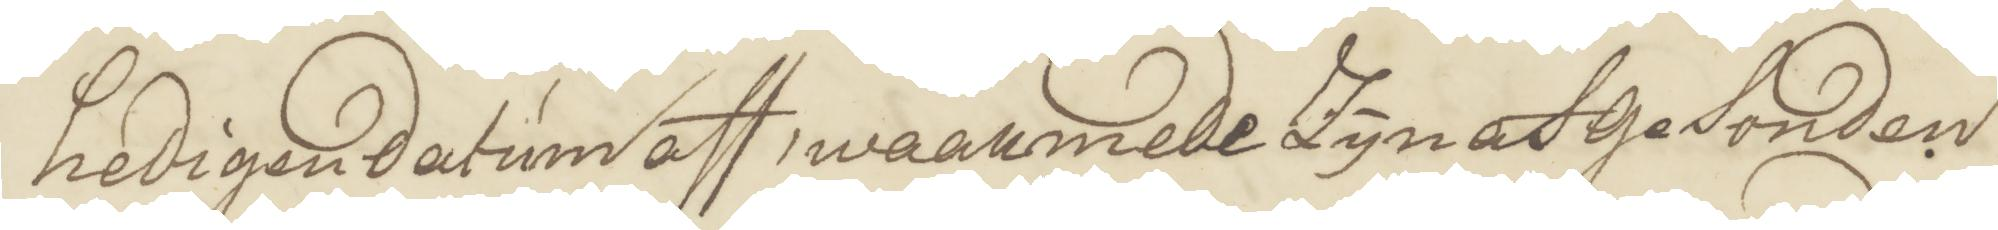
hedigen datum aff, waarmede Zijn afgesonden
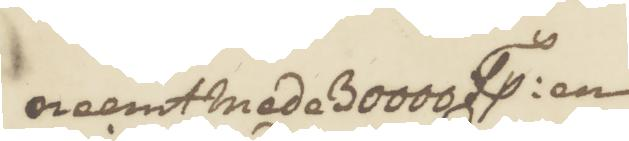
neemt mede 30000 Sp:s en
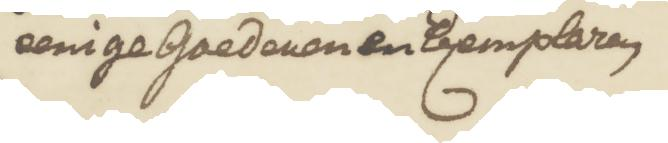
eenige goedenen en Exemplaren
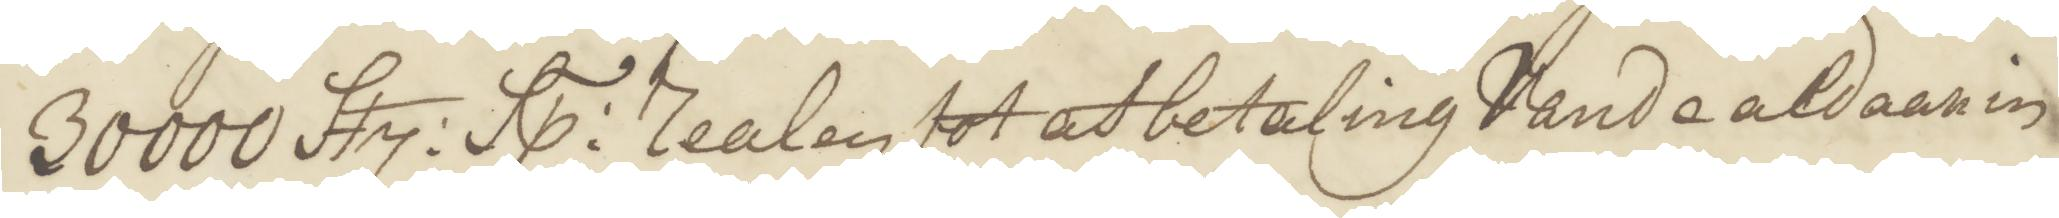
30000 Stx: Sp: realen tot afbetaling vande aldaar in
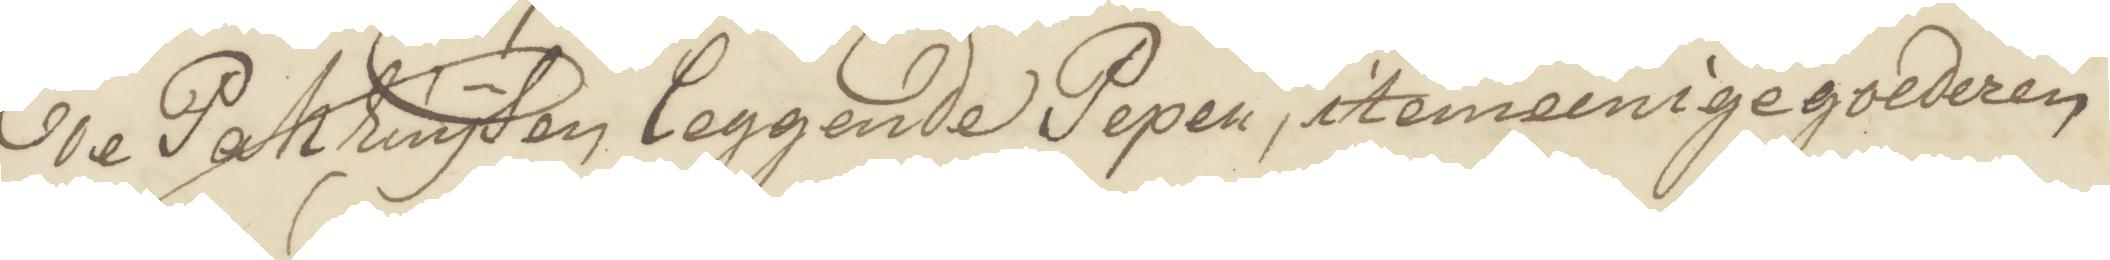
de Pakhuijsen leggende Peper, item eenige goederen
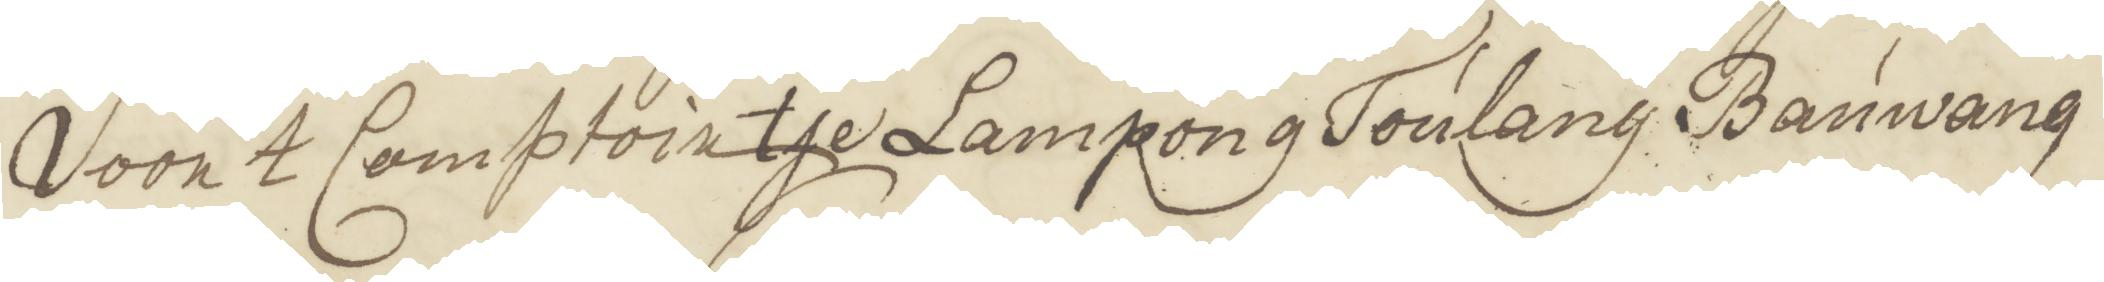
voor ’t comptoirtje Lampong Toulang Bauwang
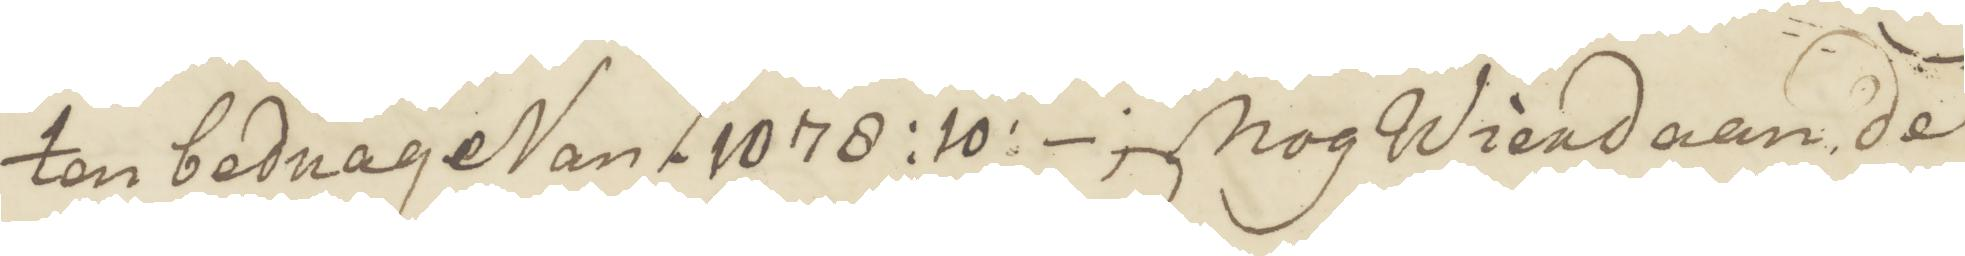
ten bedrage Van ƒ 1078:10:–; nog wierd aan de
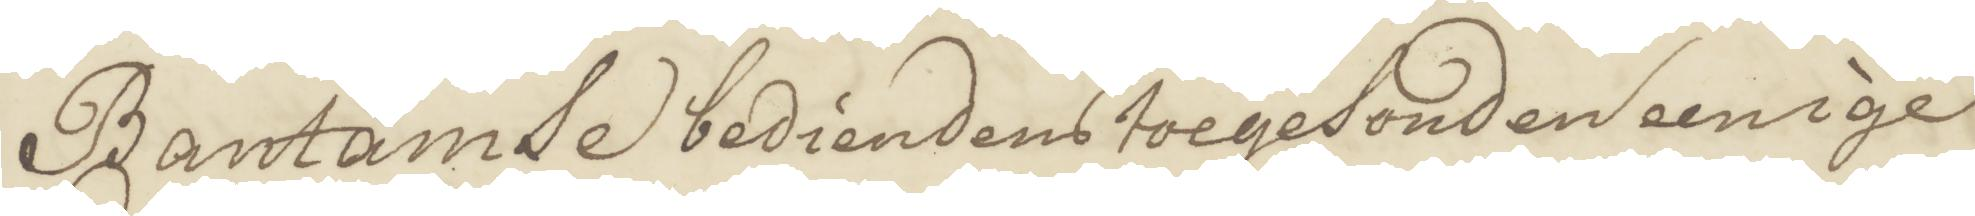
Bantamse bediendens toegesonden eenige
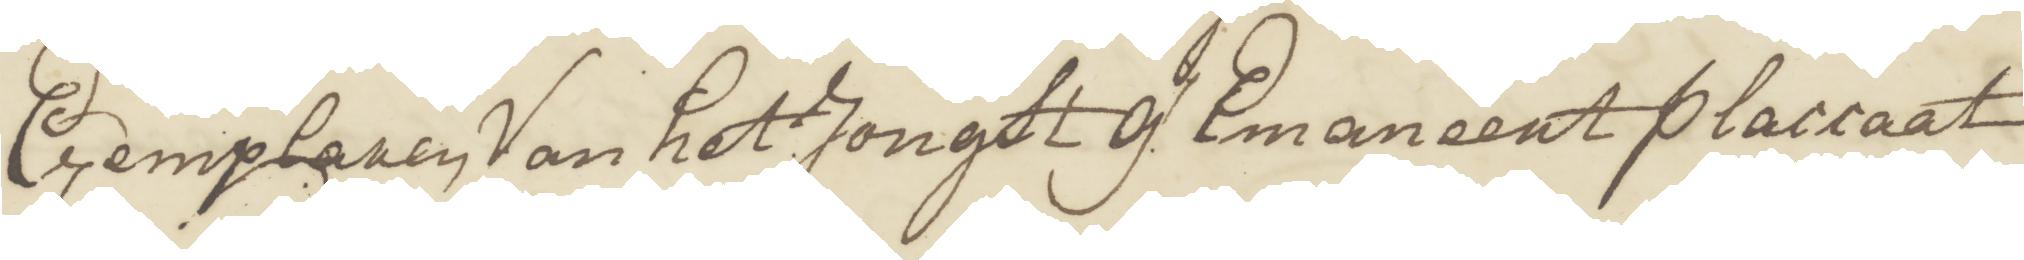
Exemplaren Van het Jongst g' Emaneert placcaat
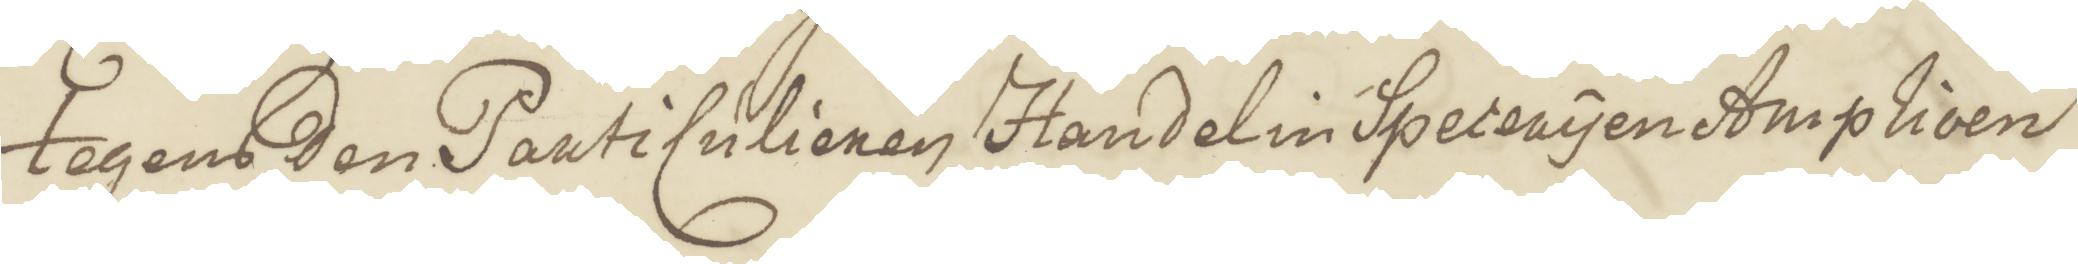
tegens den Particulieren Handel in Specerijen Amphioen
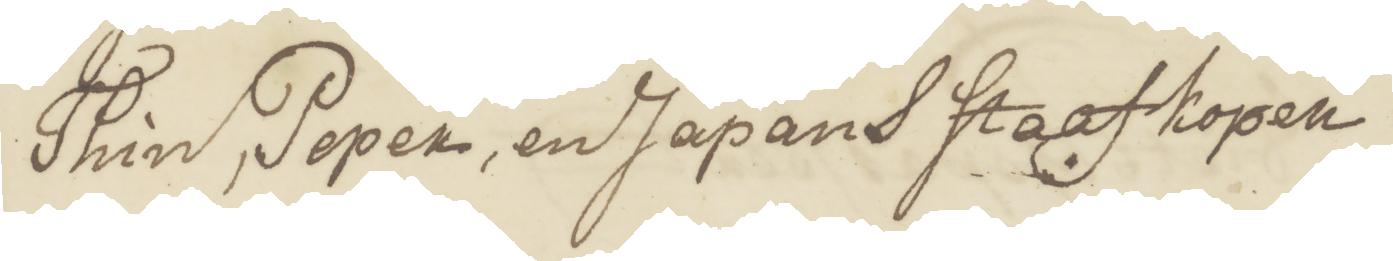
Thin, Peper, en Japans Staaf koper.
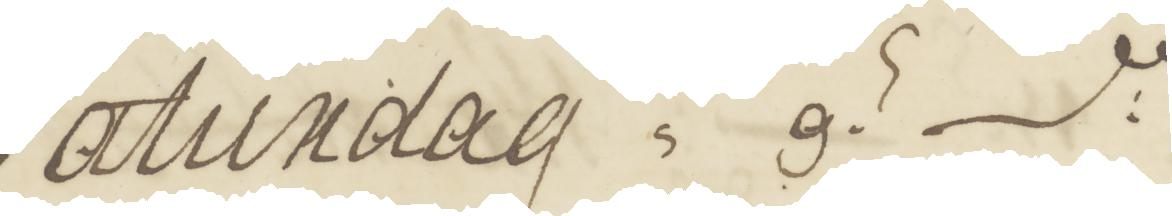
aturdag „ 9.' d:o
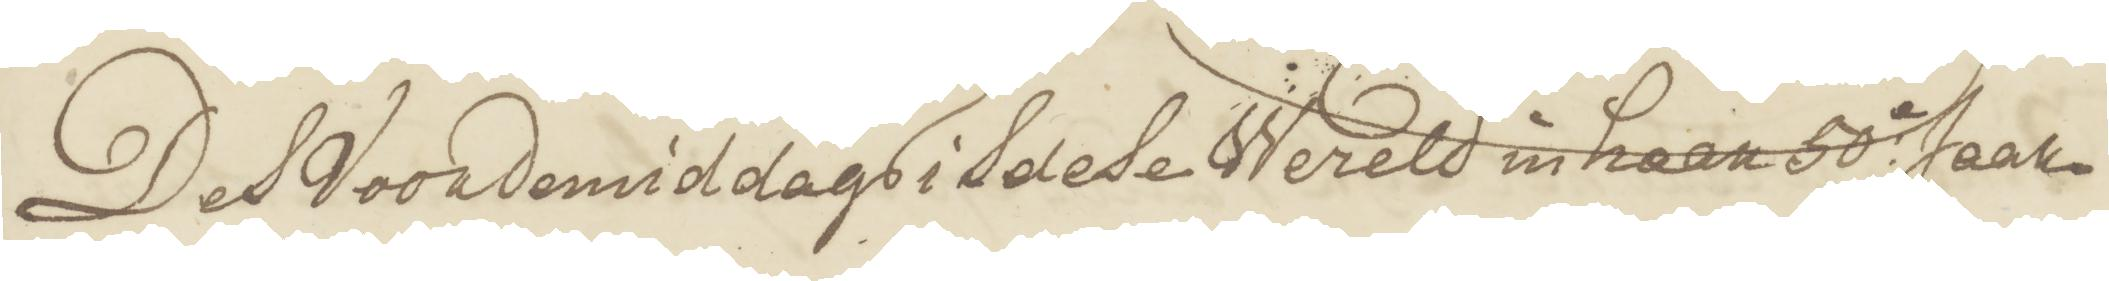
Des voordemiddags is dese Wereld in haar 50:e Jaar
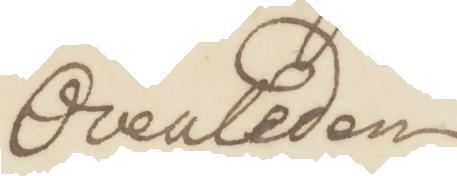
Overleden
